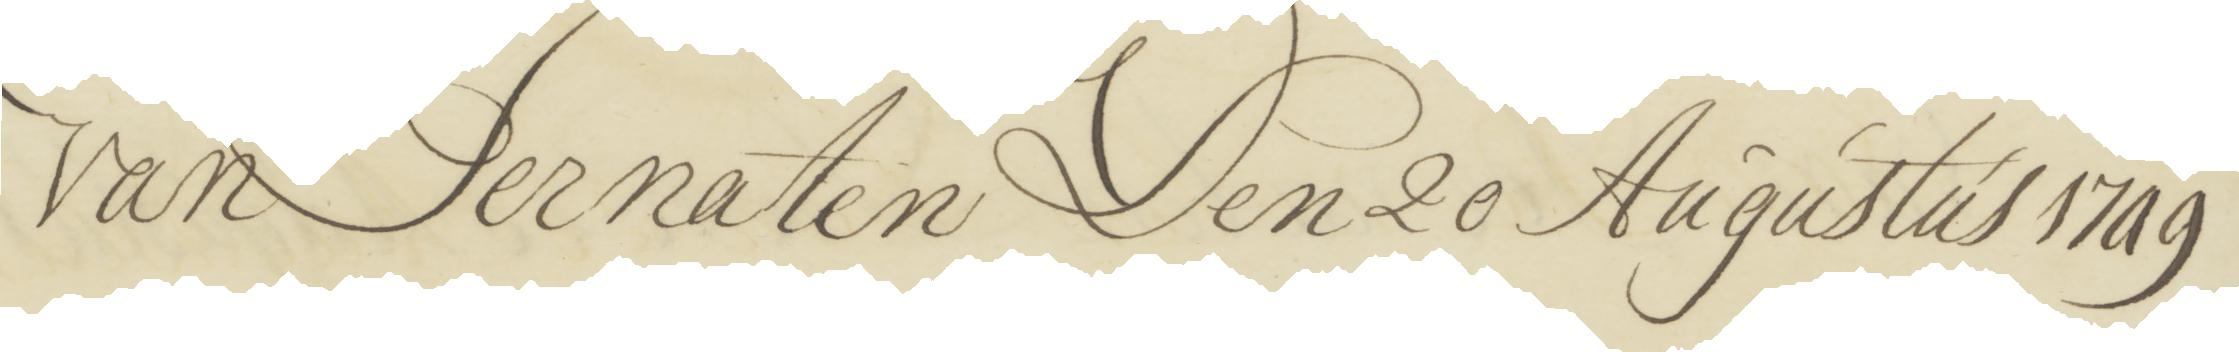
Van Ternaten Den 20 Augustus 1749
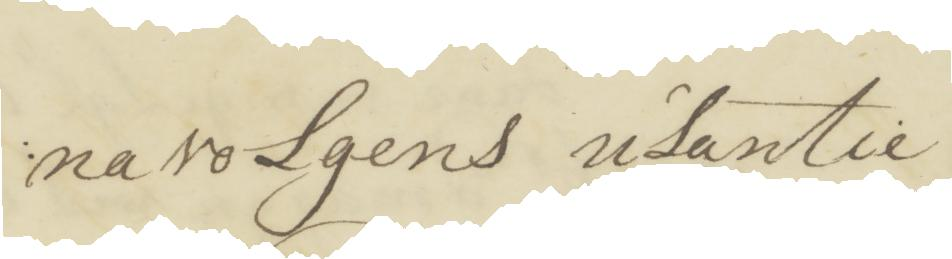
na volgens ulantie
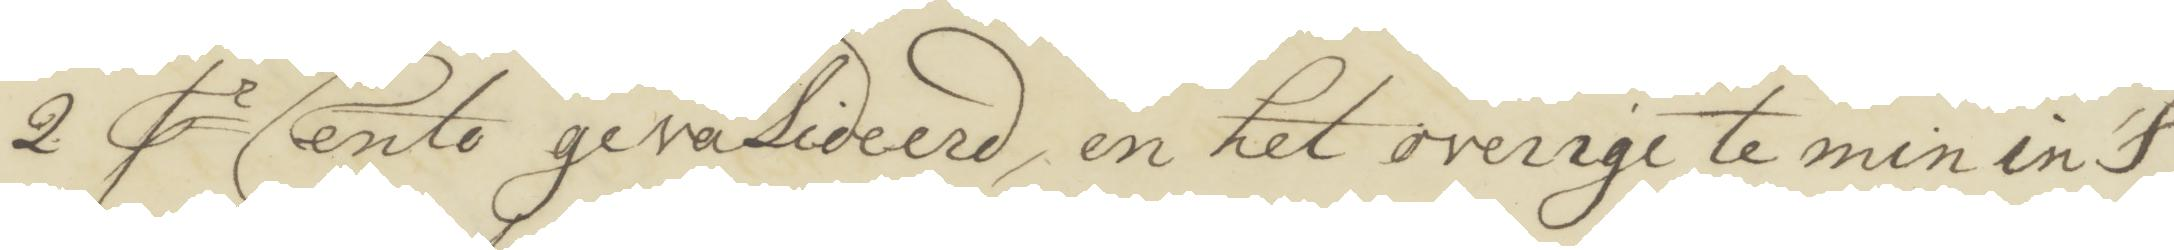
2. p=r Cento gevalideerd, en het overige te min in 's
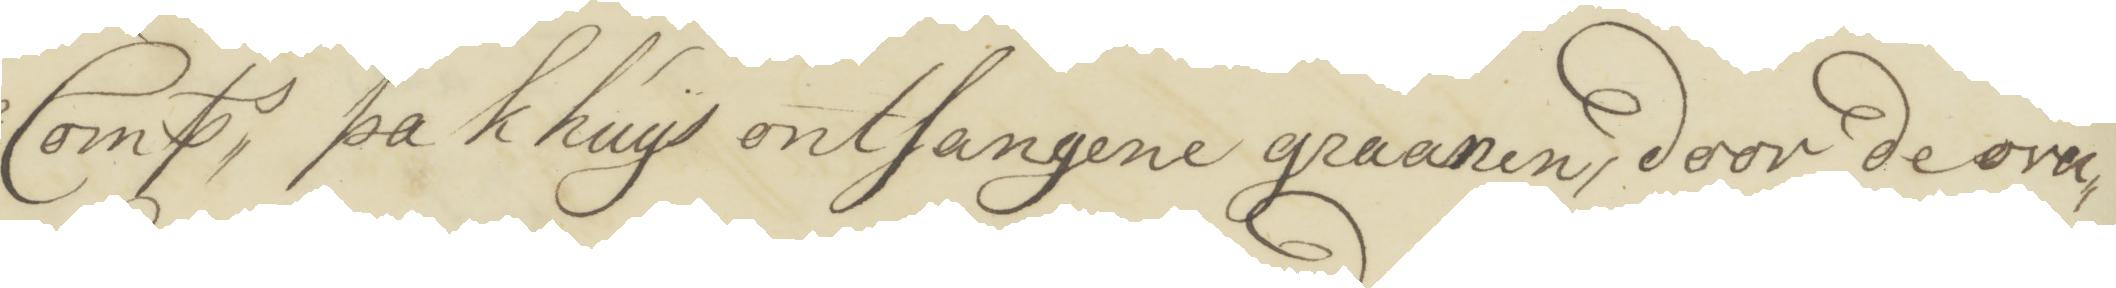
Comp„s pakhuijs ontfangene graanen, door de over„
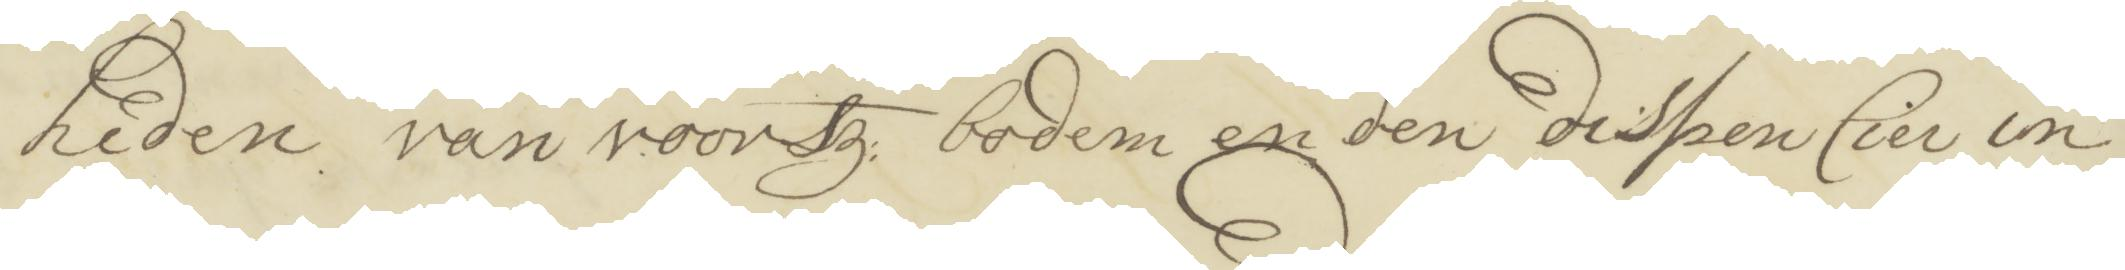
heden van voorsz: bodem en den dispen Cier in
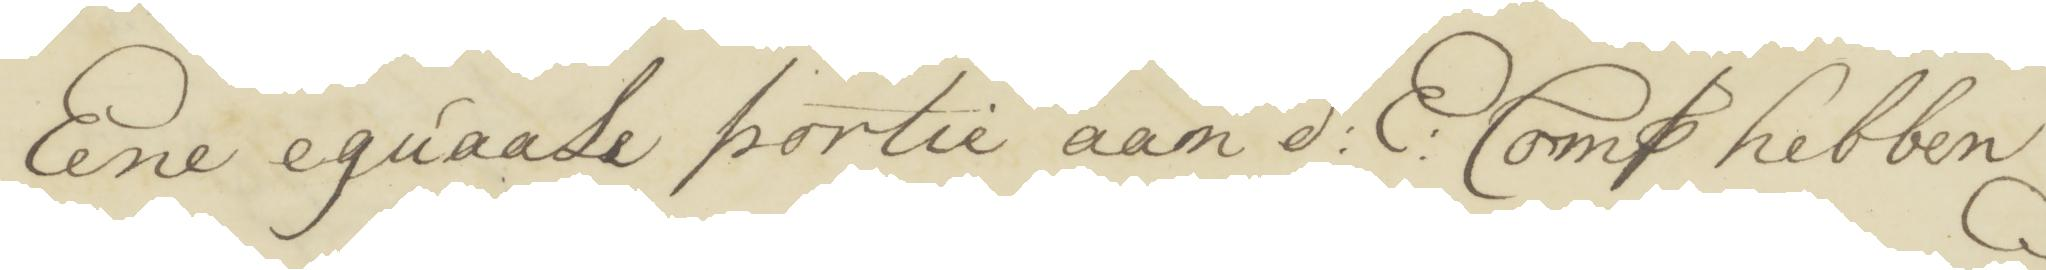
Eene eguaale portie aan d: E: Comp hebben
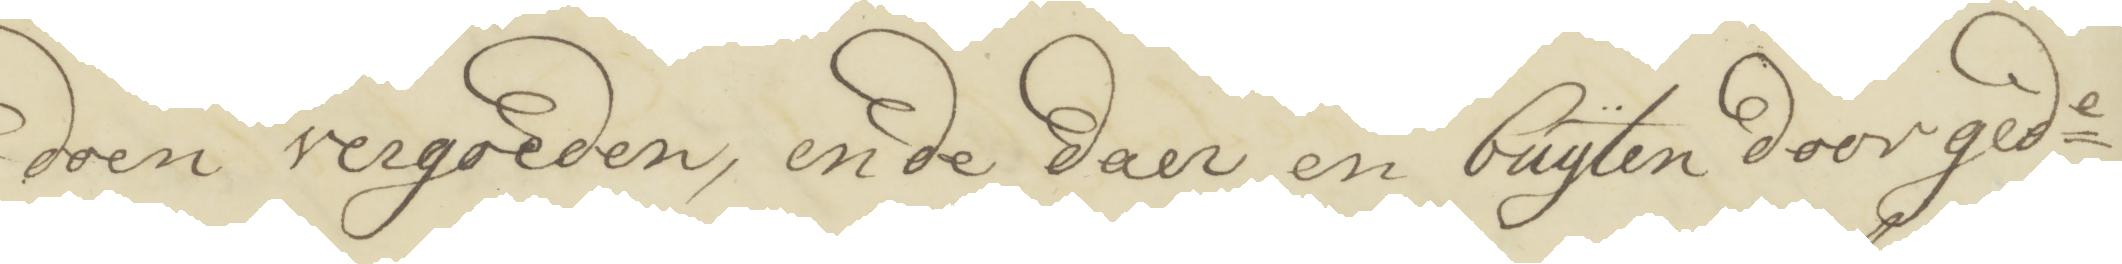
doen vergoeden, en de daer en buijten door ged=e
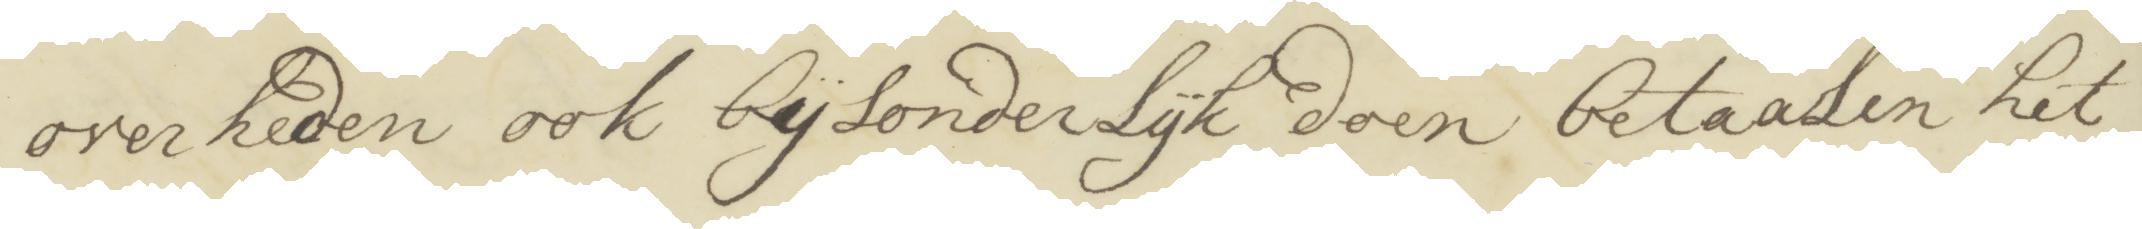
overheden ook bijsonderlijk doen betaalen het
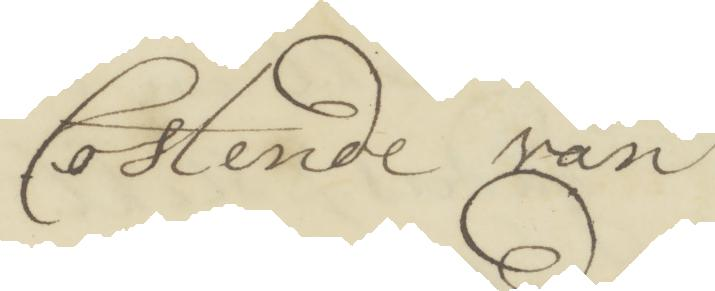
Costende van
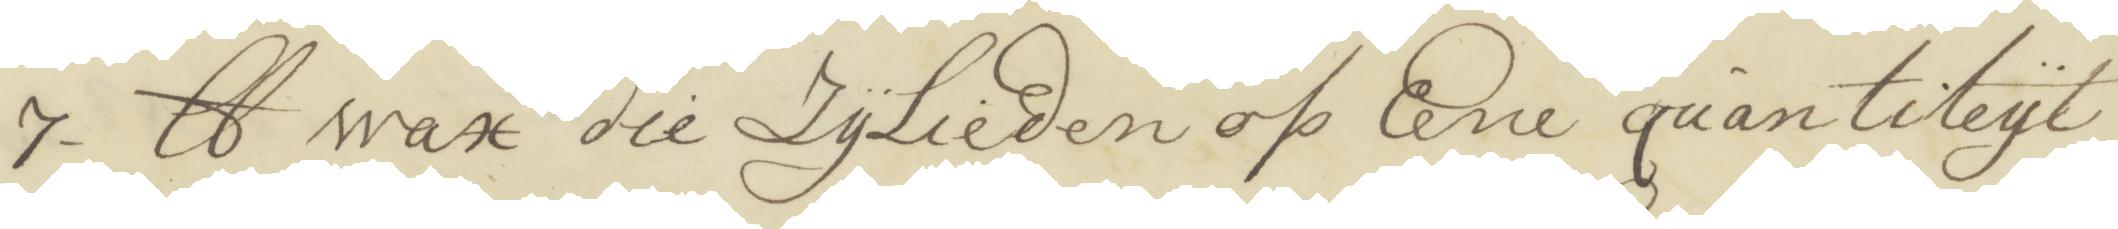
7. lb wax die zijlieden op Eene quantiteijt
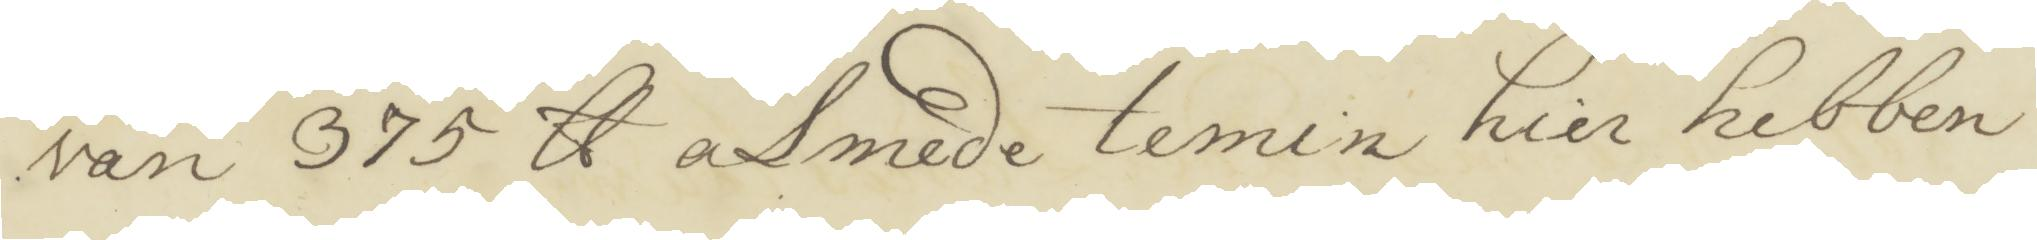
van 375 lb almede temin hier hebben
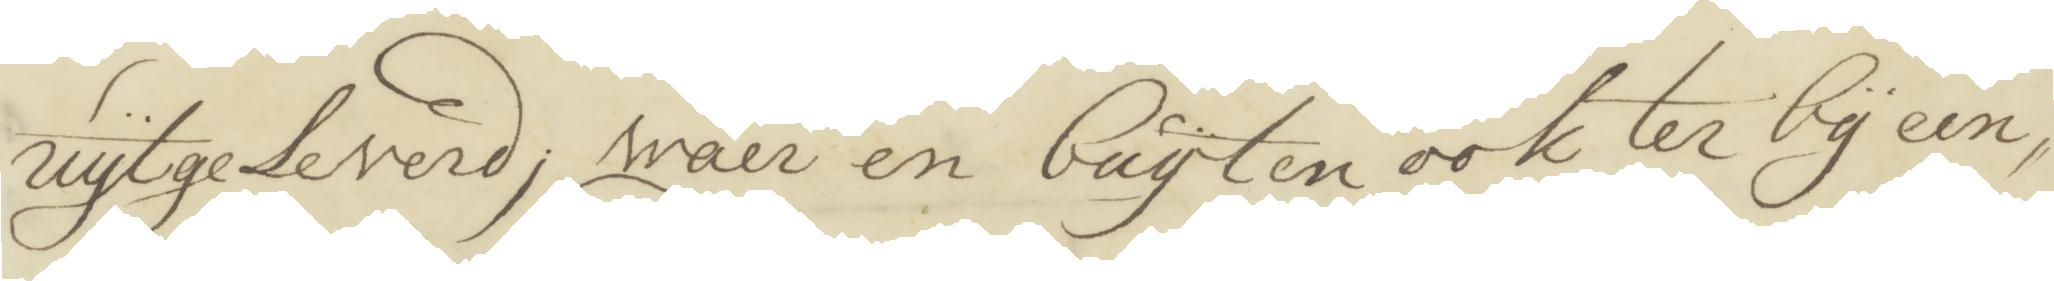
uijtgeleverd; waer en buijten ook ter bij een„
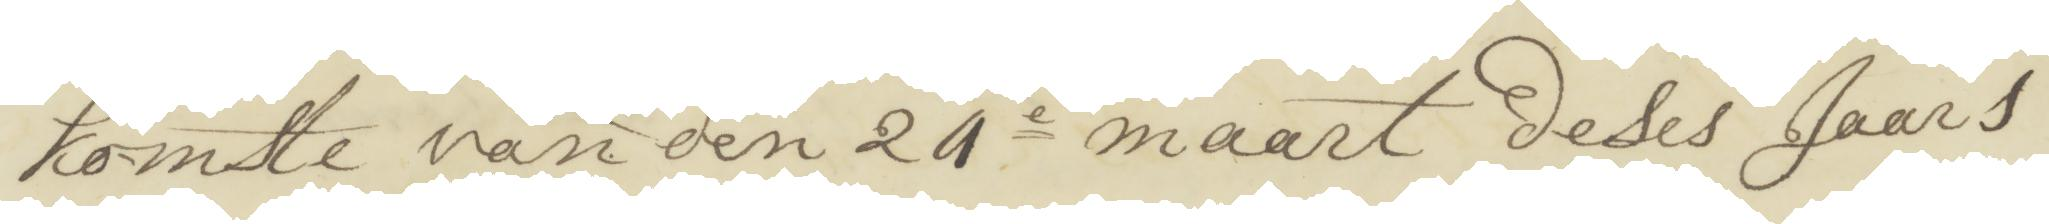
komste van den 24=e maart deses Jaars
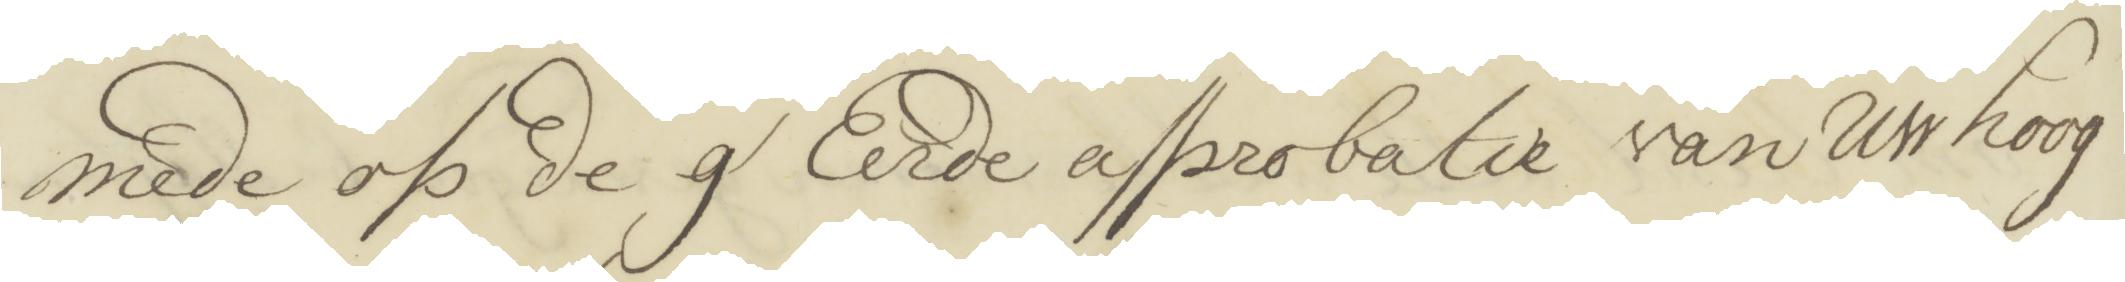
mede op de g’Eerde approbatie van uw hoog
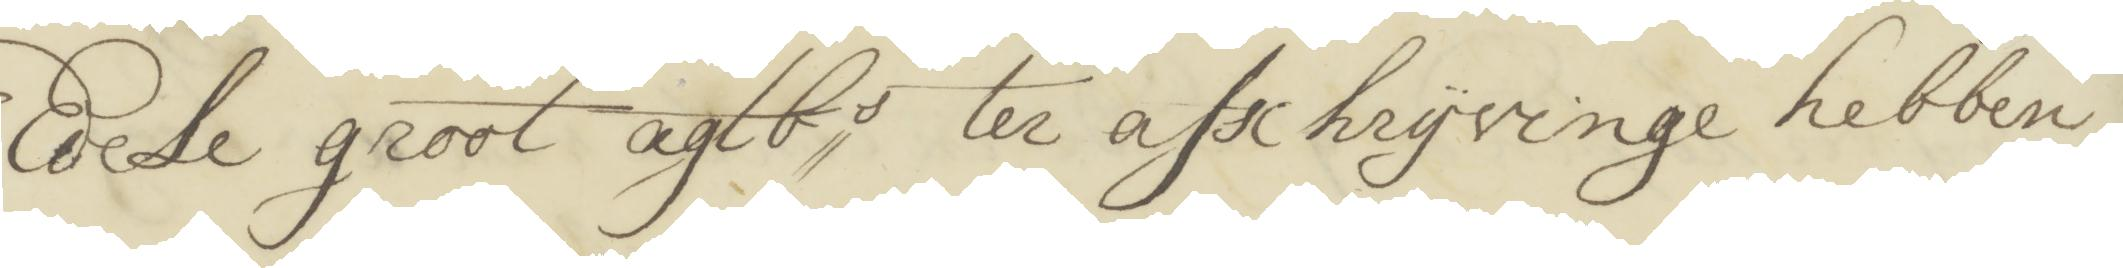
Edele groot agtb„s ter afschrijvinge hebben
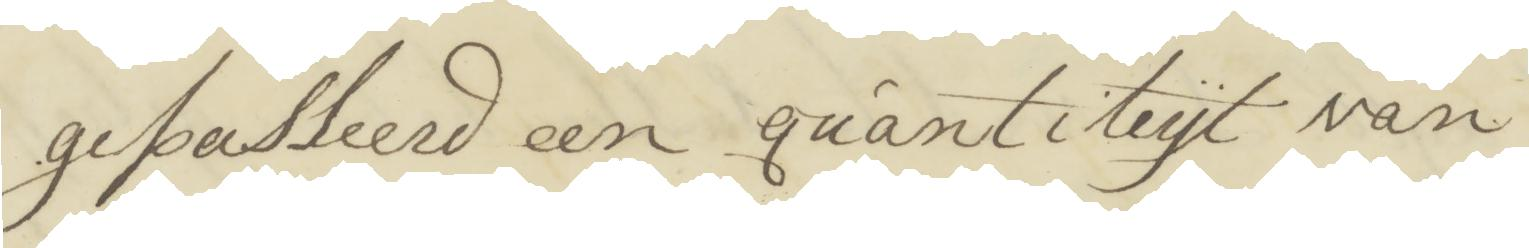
gepasseerd een quantiteijt van
